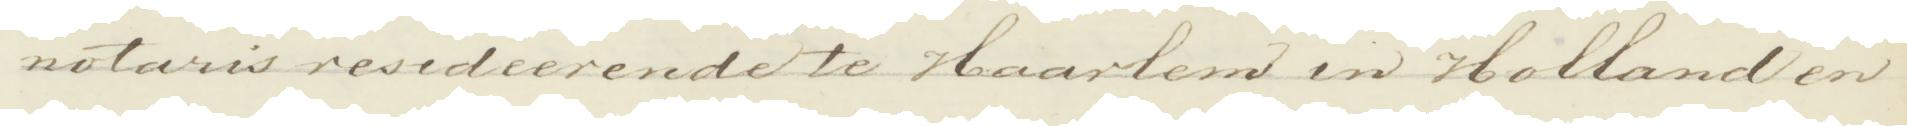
notaris resideerende te Haarlem in Holland en
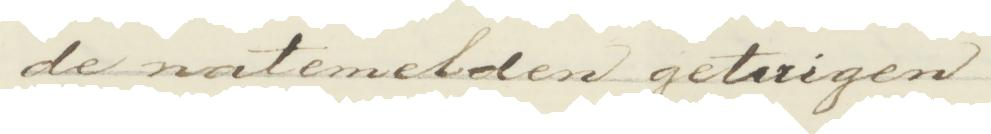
de natemelden getuigen
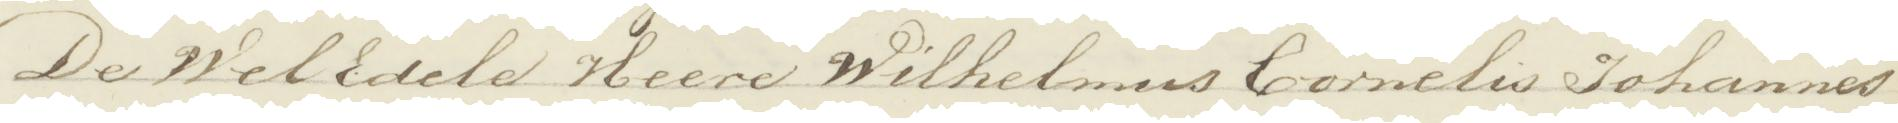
De Wel Edele Heere Wilhelmus Cornelis Iohannes
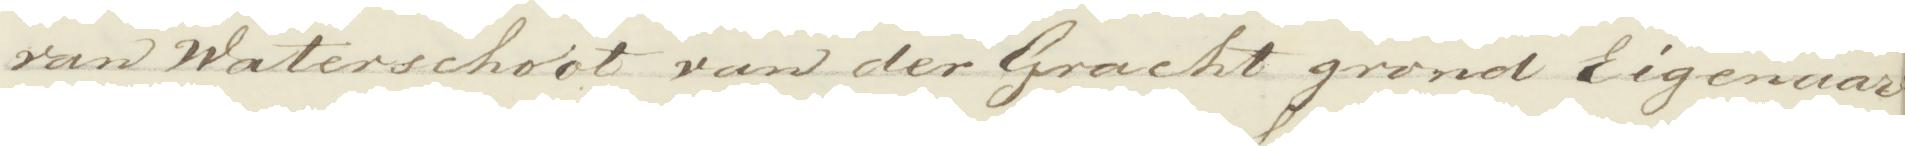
van Waterschoot van der Gracht grond Eigenaar
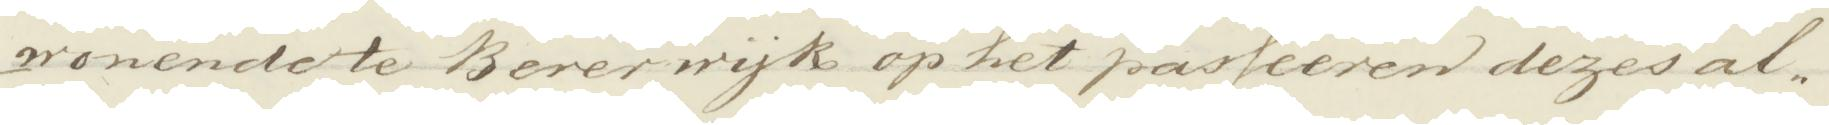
wonende te Beverwijk op het passeeren dezes al„
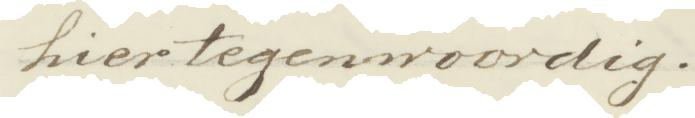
hier tegenwoordig.
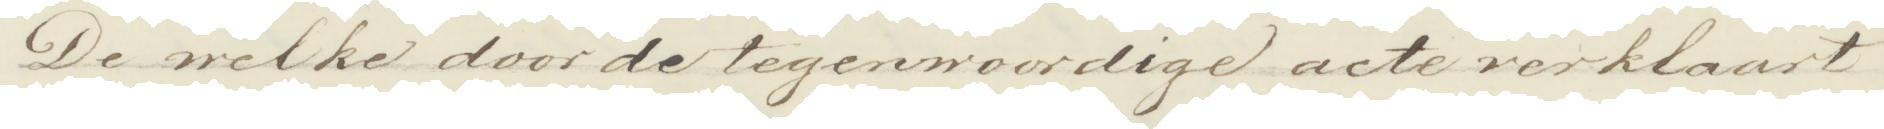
De welke door de tegenwoordige acte verklaart
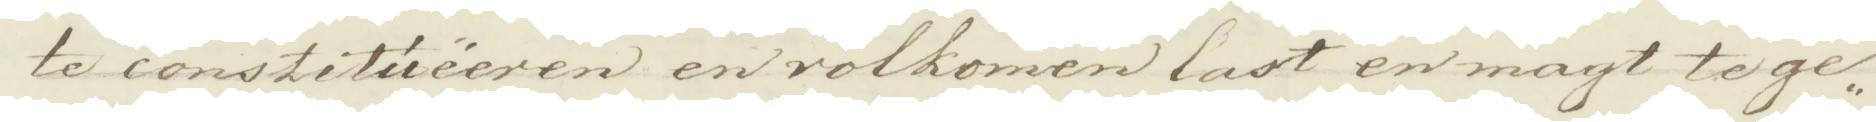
te constitueeren en volkomen last en magt te ge„
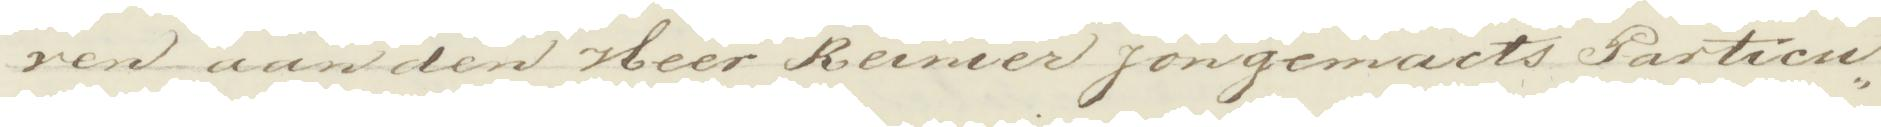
ven aan den Heer Reinier Jongemaets Particu„
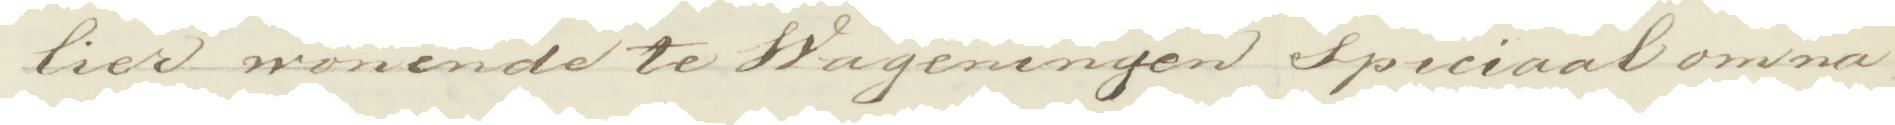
lier wonende te Wageningen speciaal om na
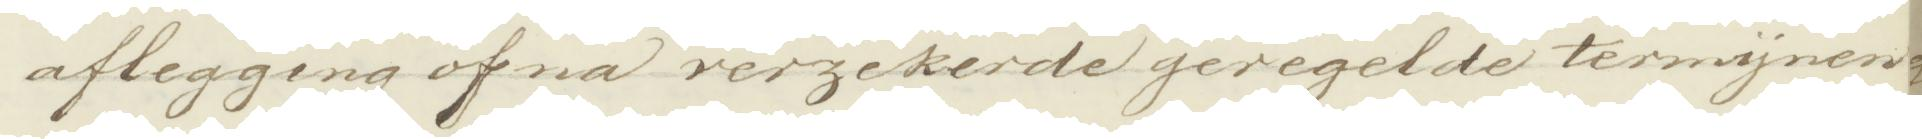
aflegging of na verzekerde geregelde termijnen
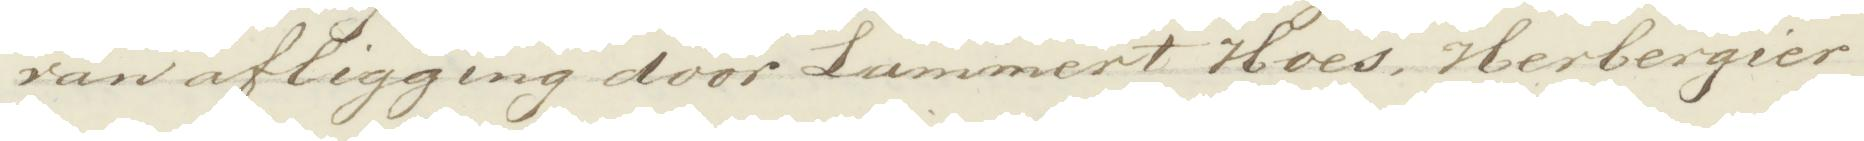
van afligging door Lammert Hoes, Herbergier
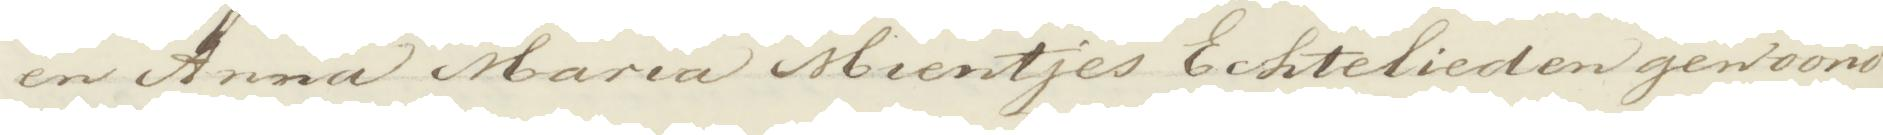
en Anna Maria Mientjes Echtelieden gewoond
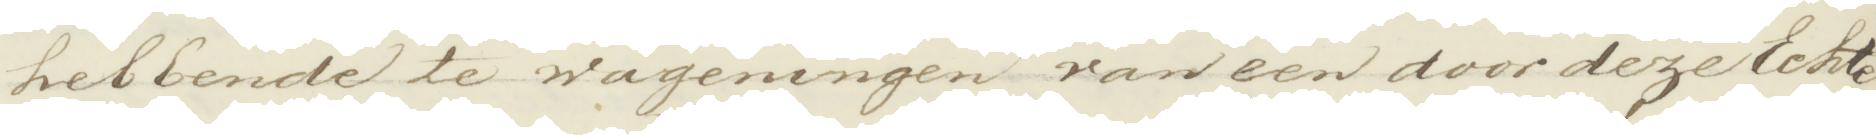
hebbende te wageningen van een door deze Echte
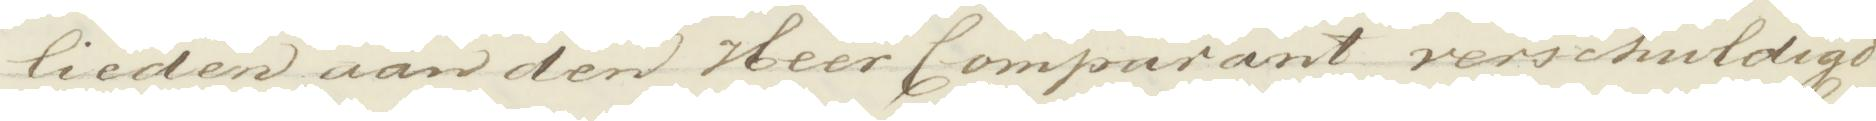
lieden aan den Heer Comparant verschuldigd
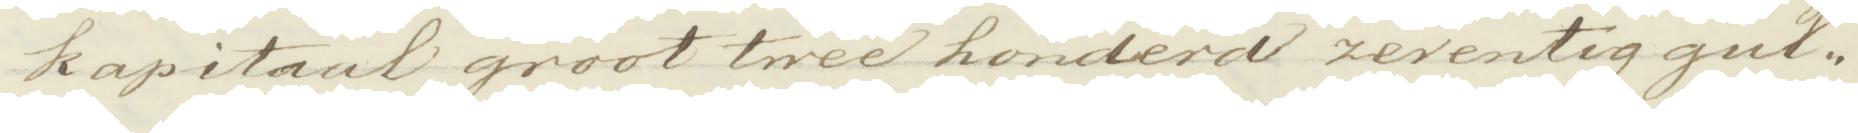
kapitaal groot twee honderd zeventig gul„
